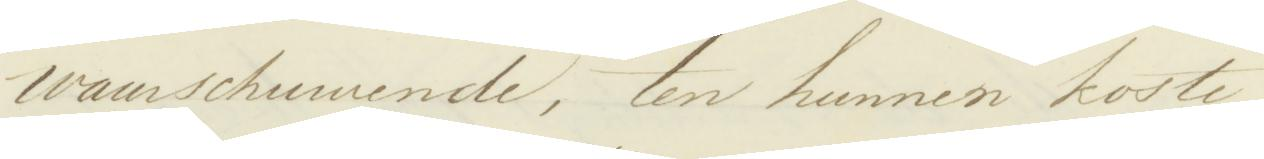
waarschuwende, ten hunnen koste
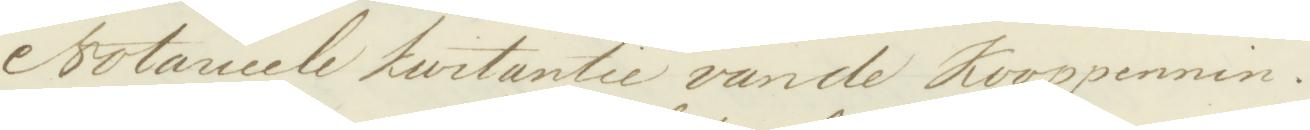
Notarieele kwitantie van de Kooppennin.
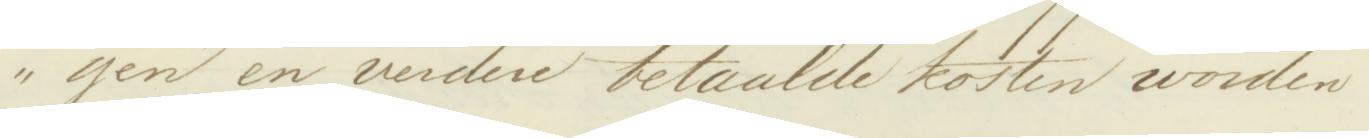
„gen en verdere betaalde kosten worden
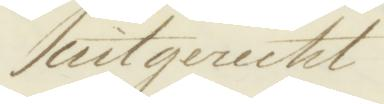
uitgereikt
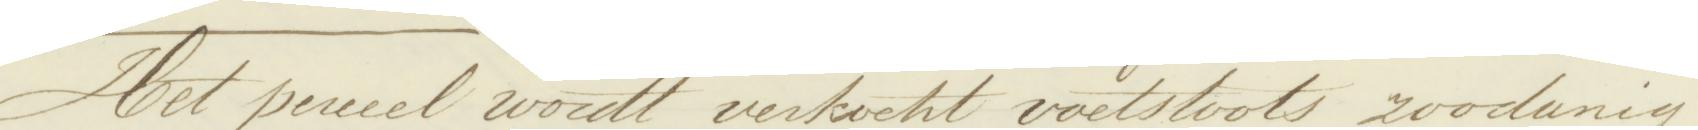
Het perceel wordt verkocht voetstoots zoodanig
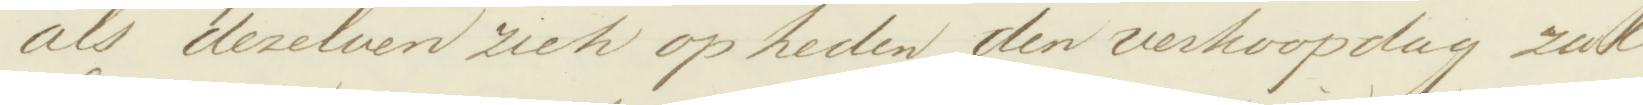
als dezelven zich op heden den verkoopdag zal
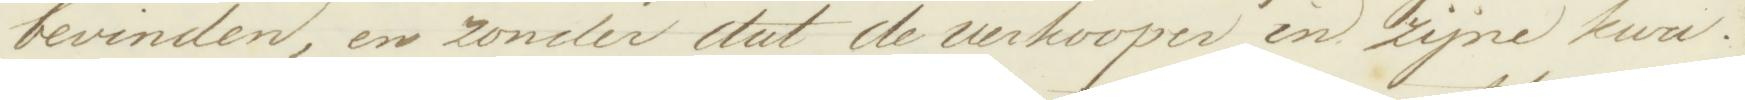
bevinden, en zonder dat de verkooper in zijne kwa„
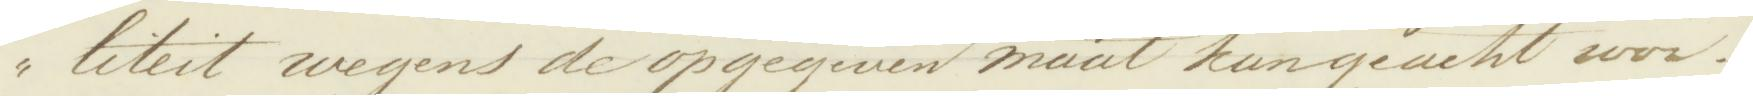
„liteit wegens de opgegeven maat kan geacht wor„
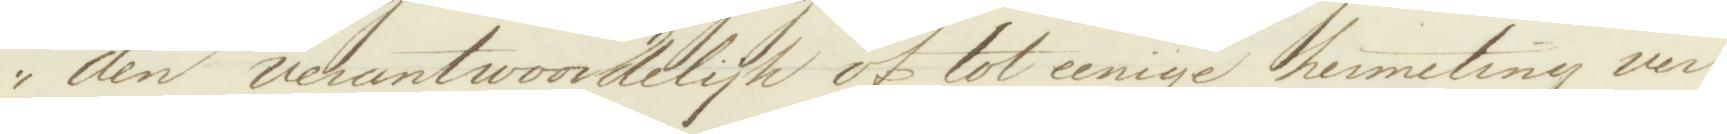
„den verantwoordelijk of tot eenige heimeting ver
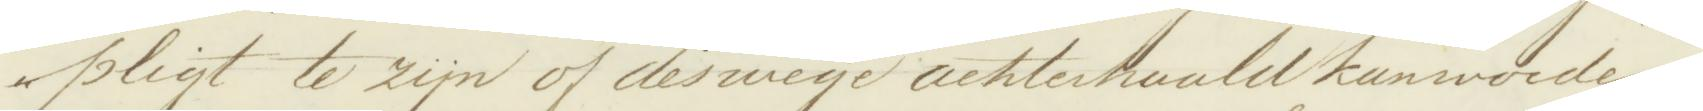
„pligt te zijn of deswege achterhaald kan worden,
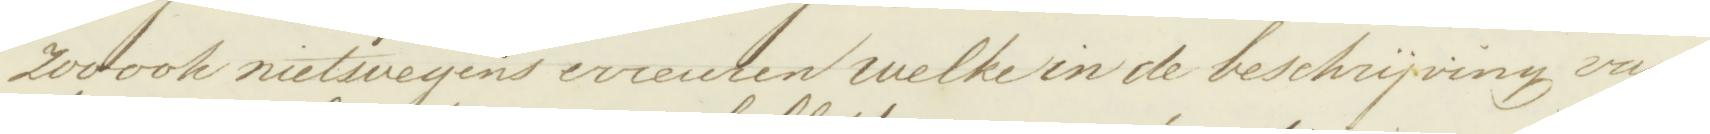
zoo ook niet wegens erreuren welke in de beschrijving van
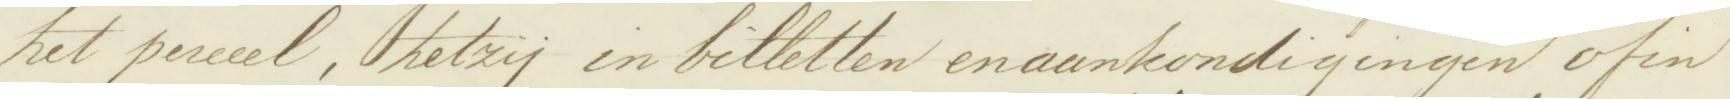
het perceel, hetzij in billetten en aankondigingen of in
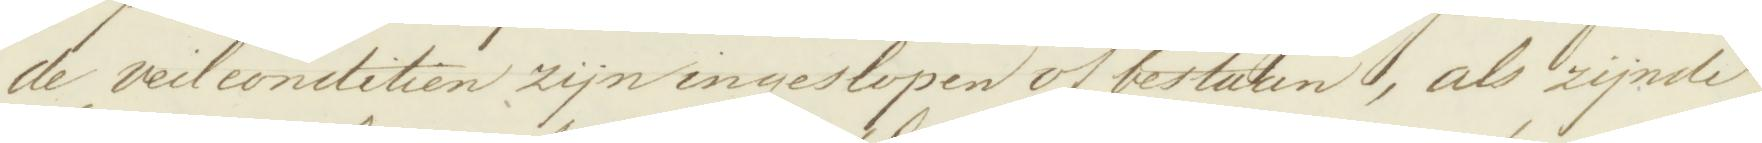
de veilconditien zijn ingeslopen of bestaan, als zijnde
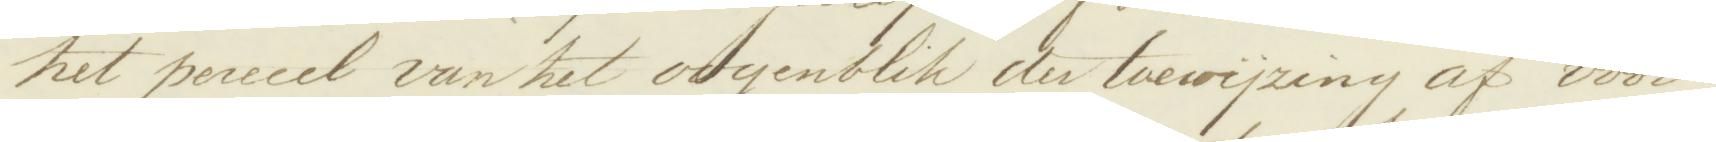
het perceel van het oogenblik der toewijzing af voor
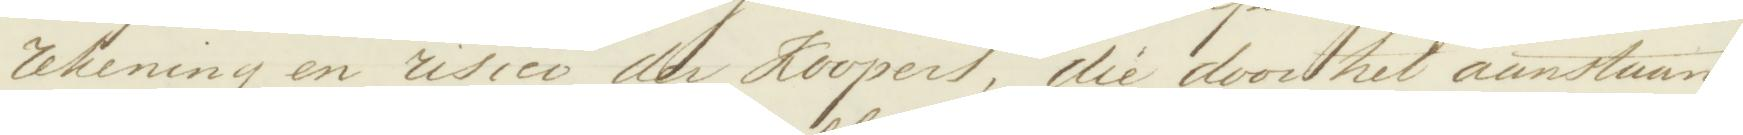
rekening en risico der Koopers, die door het aanstaan
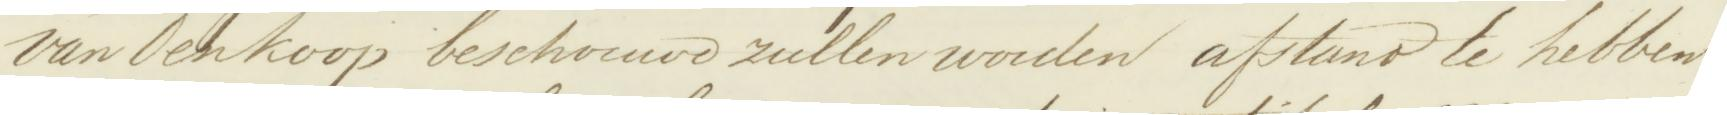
van den koop beschouwd zullen worden afstand te hebben
